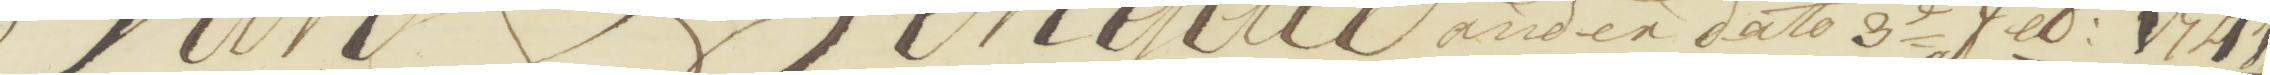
Van Bengale onder dato 3=' feb: 1741.
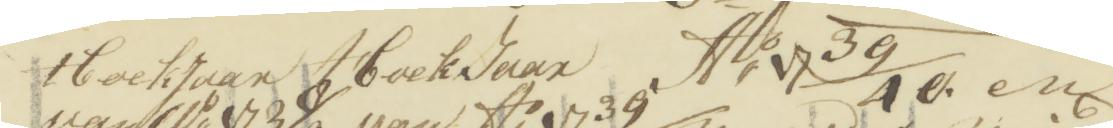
tboekjaar t'boekIaar A„o 1739/40. en
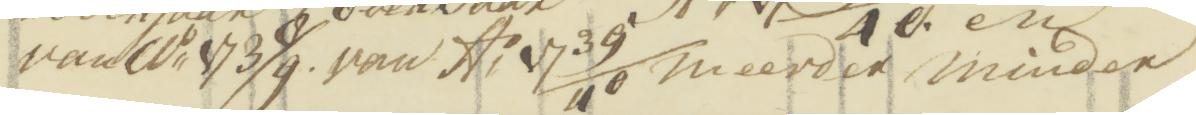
van A„o 1738/9. van A„o 1739/40 meerder minder
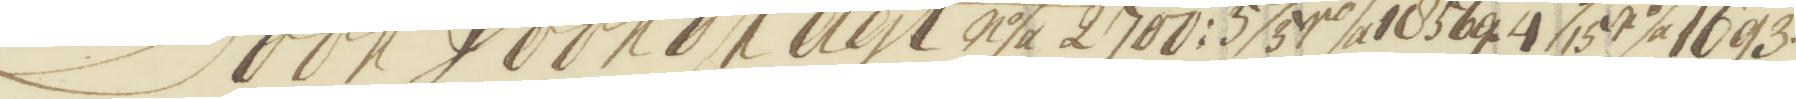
Door Voordragt ro/a 2700: 5 3/5 ro/a 18569:4 4/15 ro/a 1693.10 14/15 ro/a 3824:12: 4/15
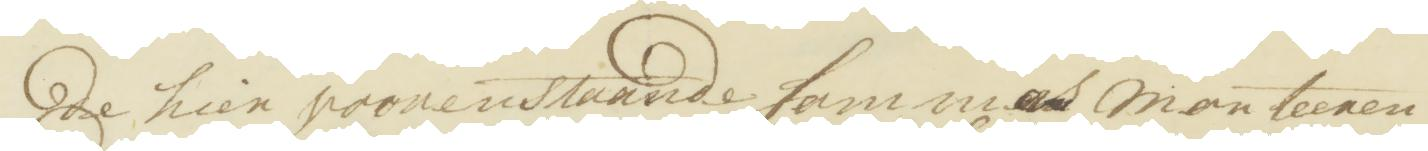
de hier voorenstaande sommas monteeren
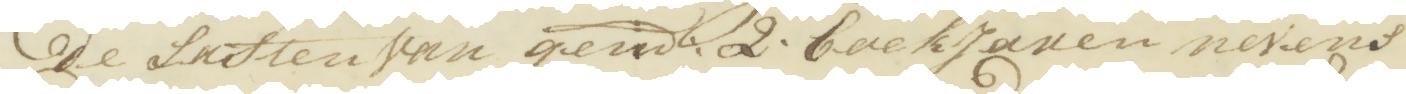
de lasten van gem: 2. boekjaren nevens
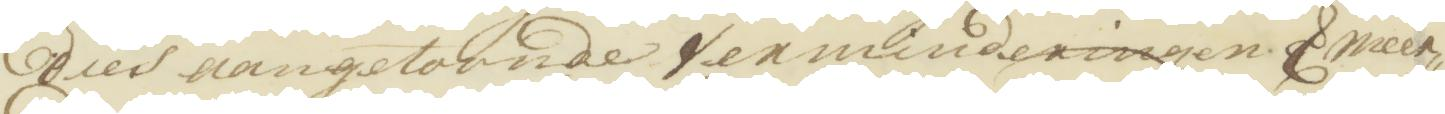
dies aangetoonde verminderingen. vermeer
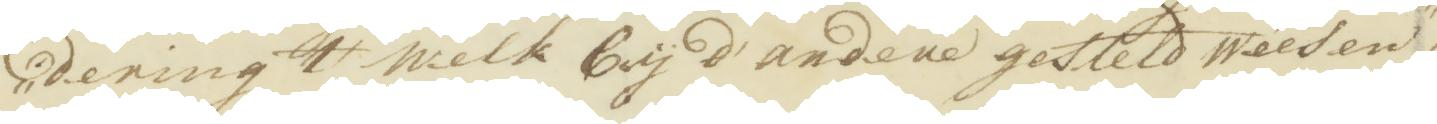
„dering t' welk bij d’ andere gesteld weesen
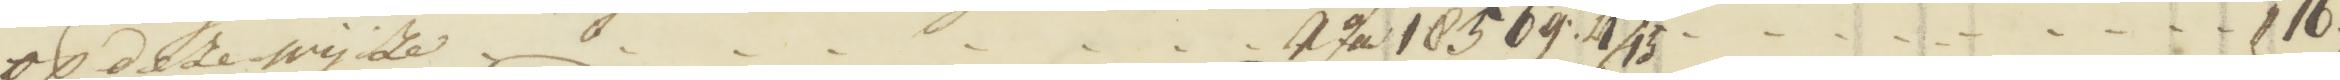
op deze wijze - - - - - - - - - r o/a 18569: 4 4/15- - - - - - - - - -11693: 10 11/15.
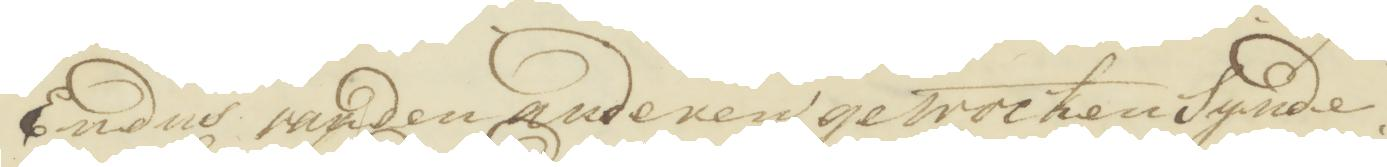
En dus van den anderen getrocken sijnde
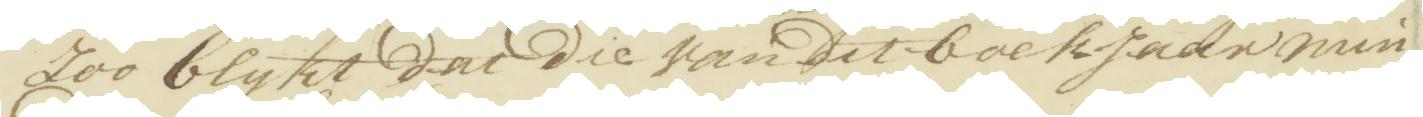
zoo blykt dat die van dit boekjaar min
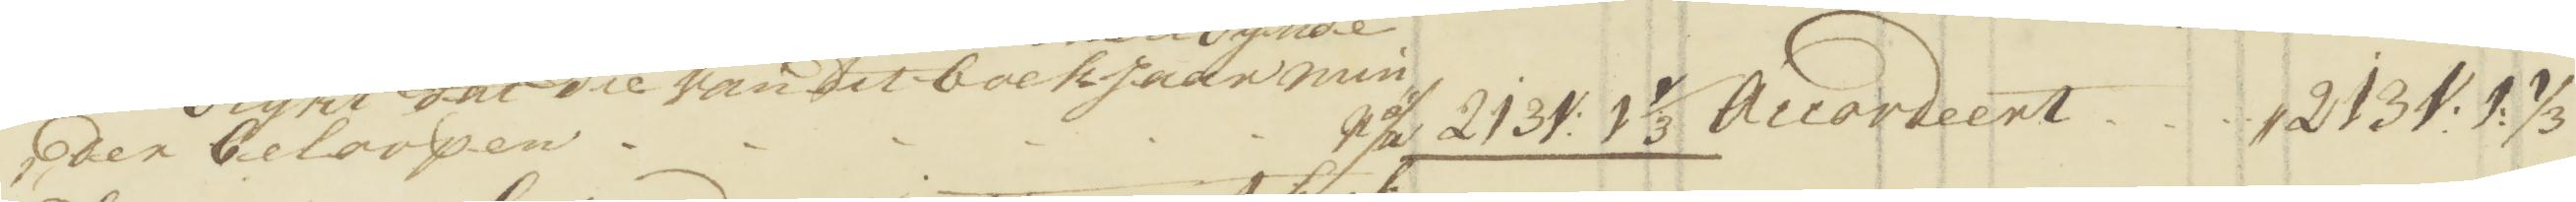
„der beloopen - - - - . - r o/a 2131: 1 1/3 Accordeert - - . .„2131:1:1/3
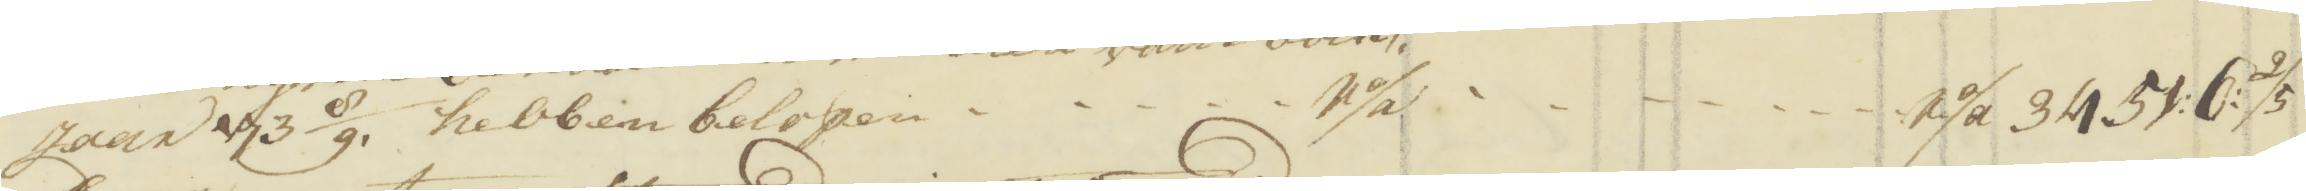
Iaar 173 8/9. hebben belopen . . . r o/a . . . r o/a 3451:6: 2/5
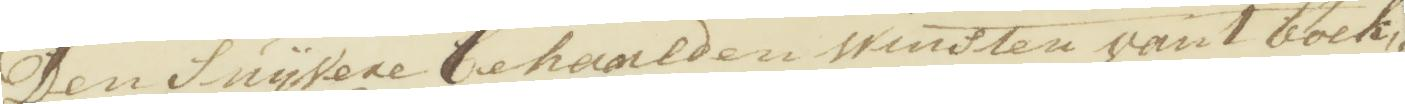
Den suijvere behaalden winsten van t boek„
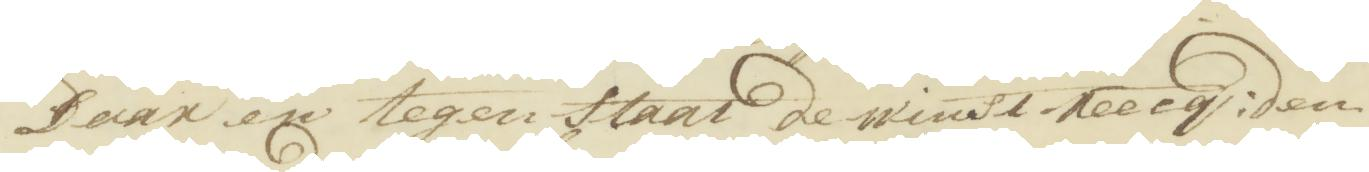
Daar en tegen staat de winst reecq: den
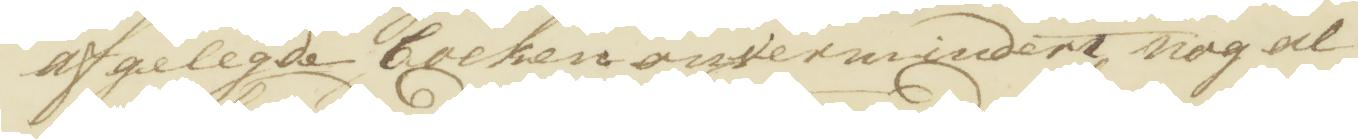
afgelegde boeken onvermindert nog al
